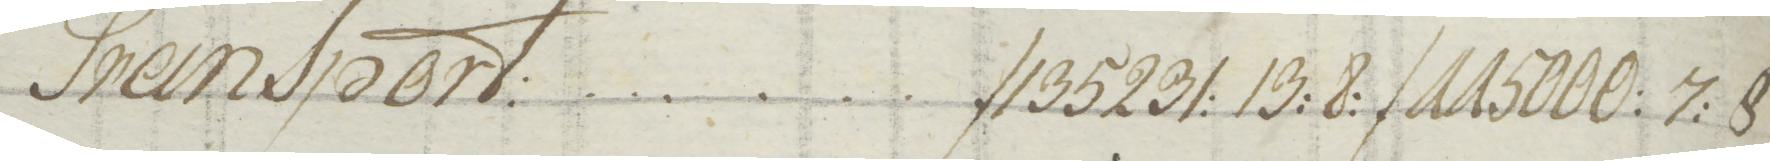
Pr Transport: . . . . . . ƒ135231: 13: 8: ƒ445000: 7: 8
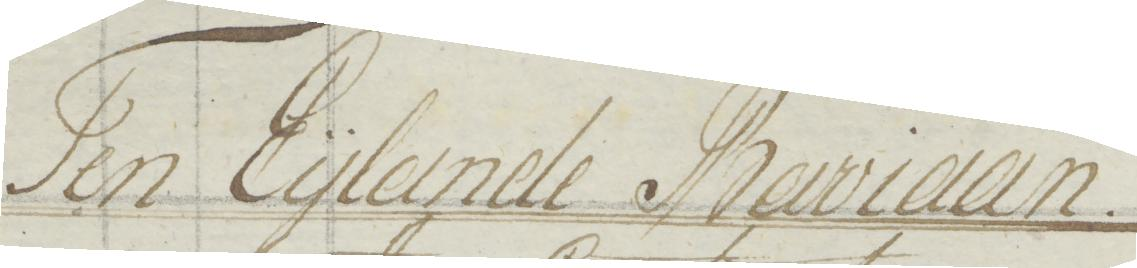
Ten Eijlande Baviaan
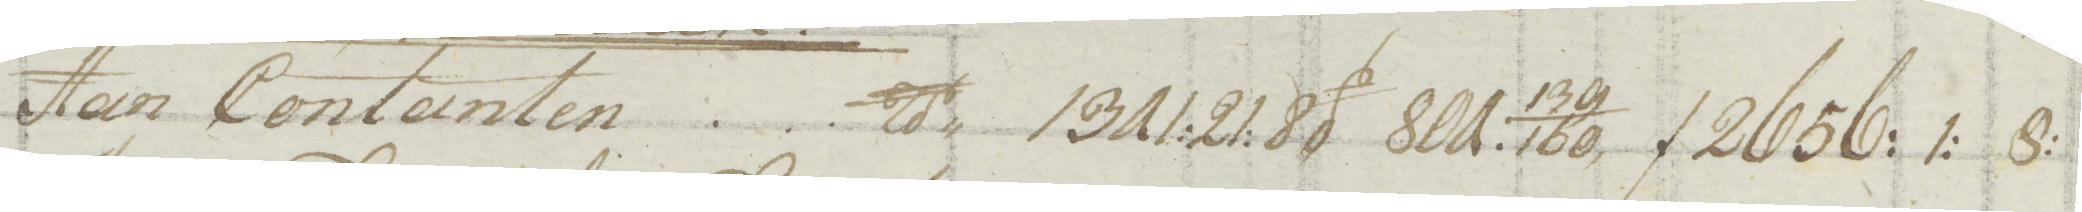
Aan Contanten . . . rd„s 1341: 21: 8 ds 804:139/160 ƒ2656: 1: 8:
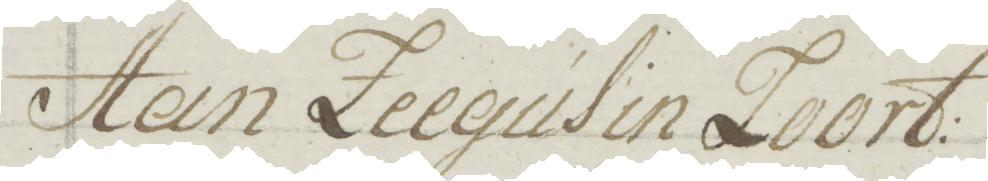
Aan Zeegus in Zoort:
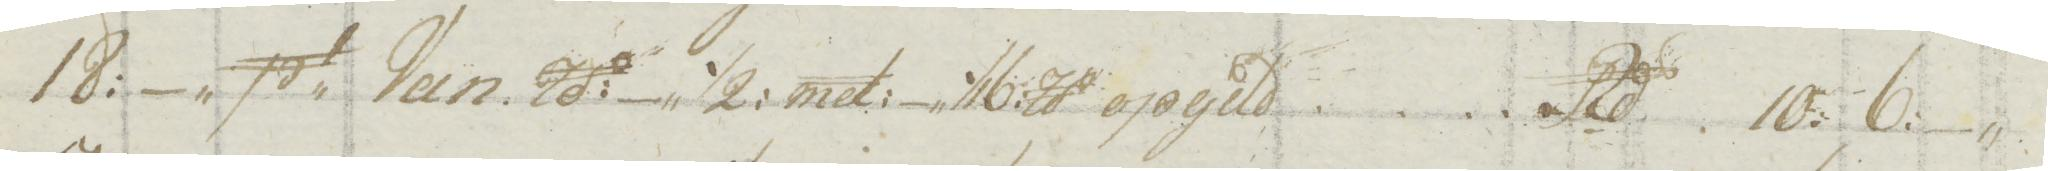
18: —„ p„s Van rd:s —„ 1/2: met:—„ 1/16: rd:s opgeld Rds 10: 6: —„
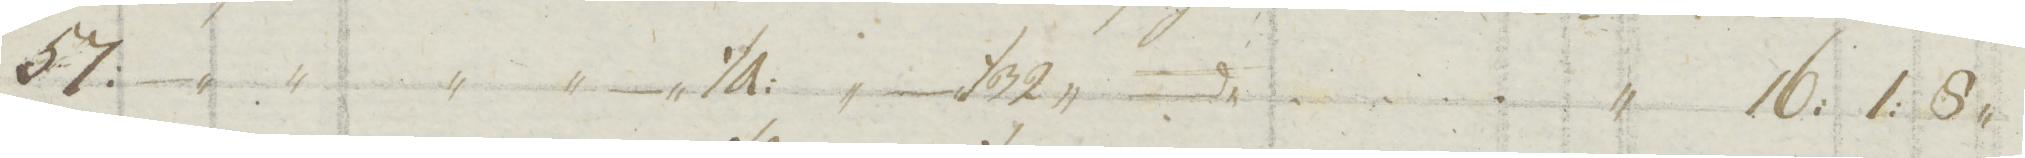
57: —„ „ „ „ —„ ¼: „ — 1/32 „ _„o . . . . „ 16: 1: 8„
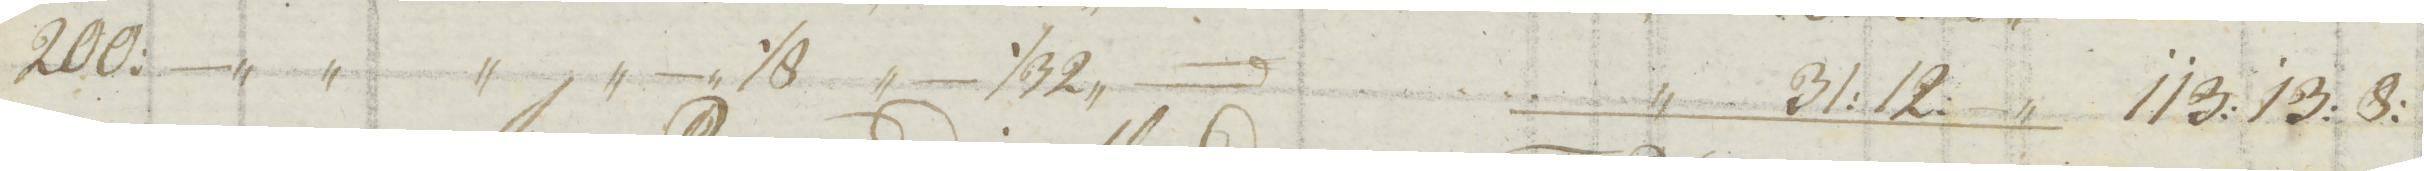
200: —„ „ „ „ —„ 1/8 „ — 1/32„ _o . . . . „ 31: 12: —„ 113: 13: 8:
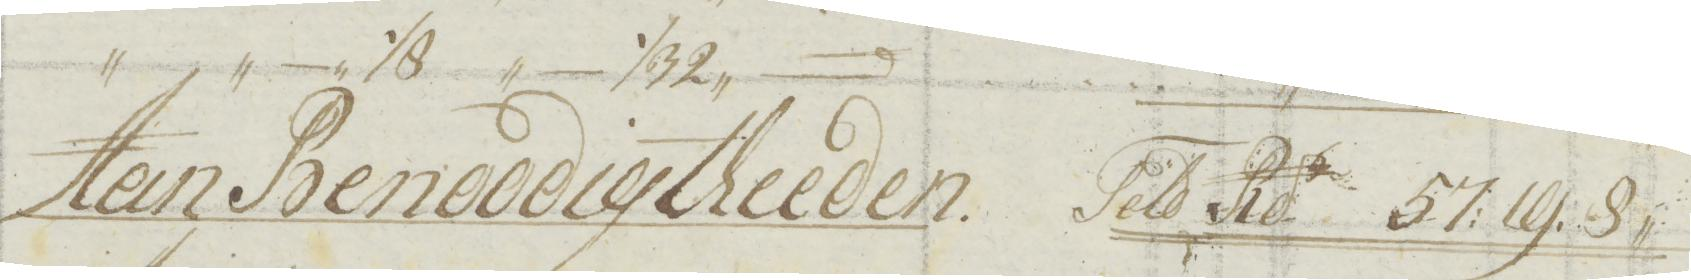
Aan Benoodigtheeden. Teld Rds 57: 19: 8„
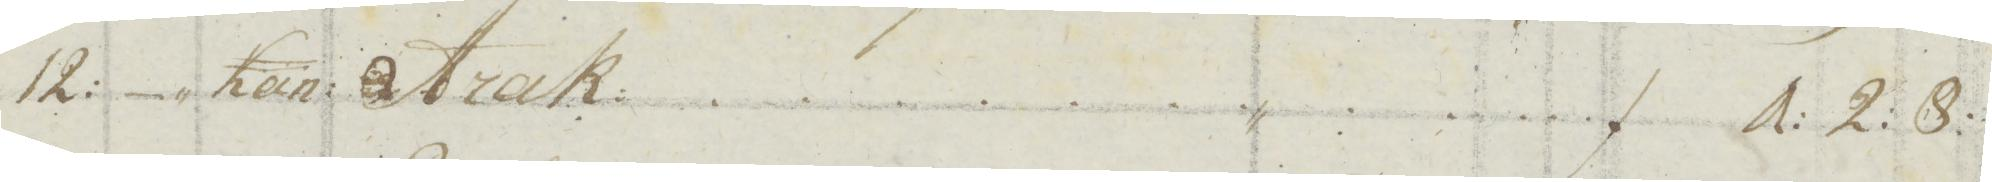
12: —„ kan: Arak: . . . . . . . „ . . . . . ƒ 4: 2: 8:
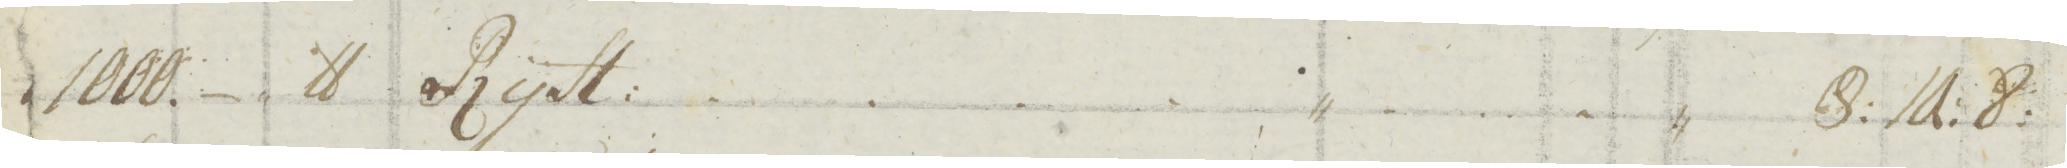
1000. —„ lb Rijst: . . . . „ . . . „ 8: 14: 8:
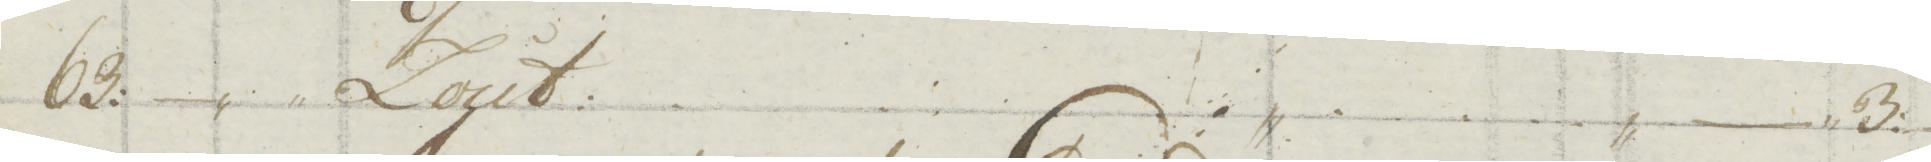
63: —„ „ Zout: . . . „ . . . . „ —„ 3:
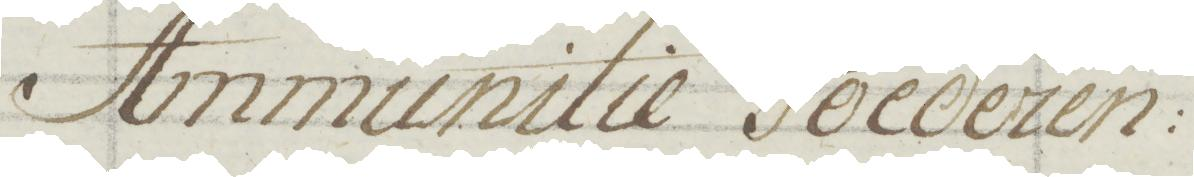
Ammunitie Goederen:
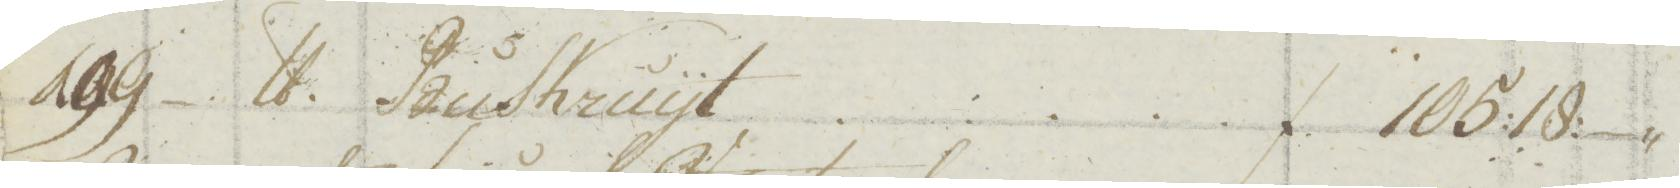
499 — lb. Buskruijt . . . . . ƒ 105: 18: —„
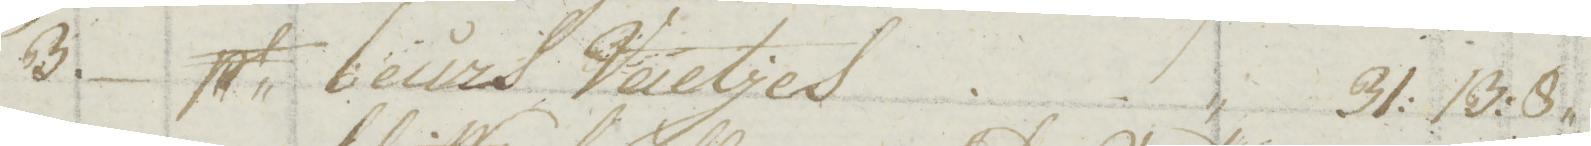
3: — p„s beurs Vaetjes . . „ 31: 13: 8„
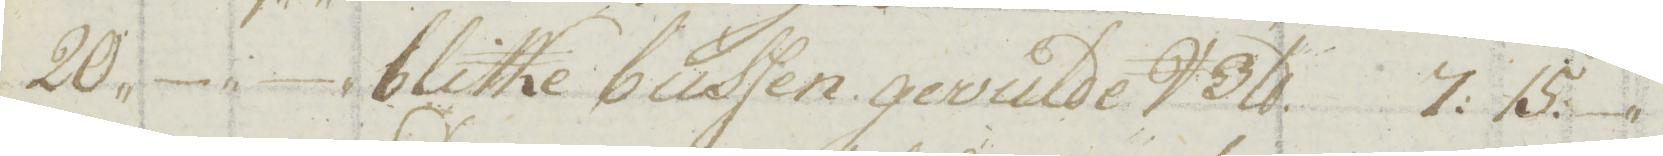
20„ —„ —„ blikke bussen gevulde V 3 lb. 7: 15: —„
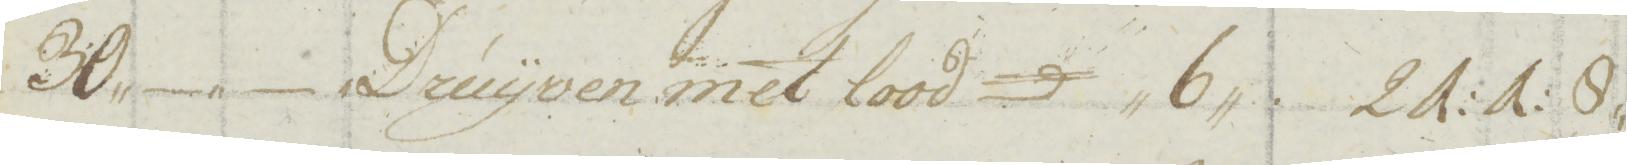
30„ —„ —„ Druijven met lood _o „ 6 „ . 24: 4: 8
